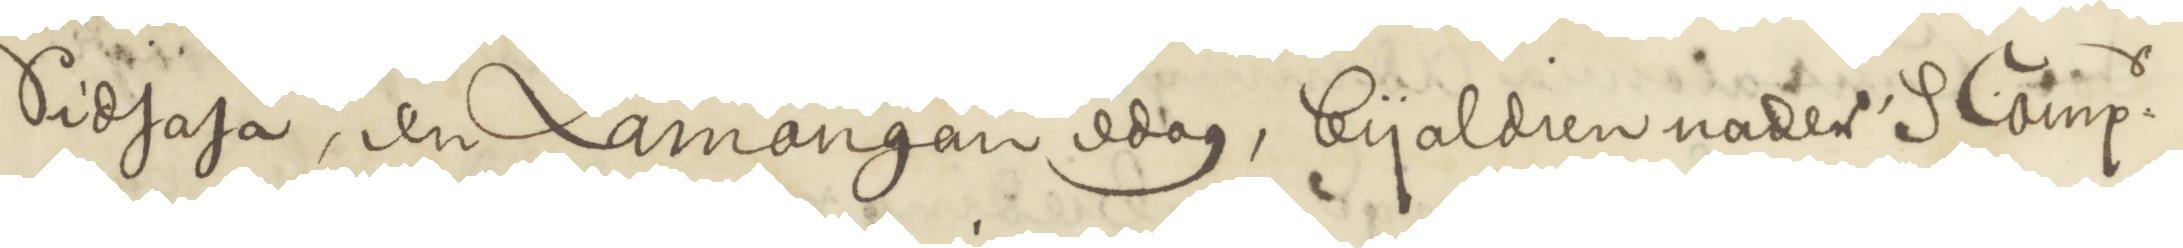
sidjaja, en Lamongan edog, bij aldien nader ’s Comp:s
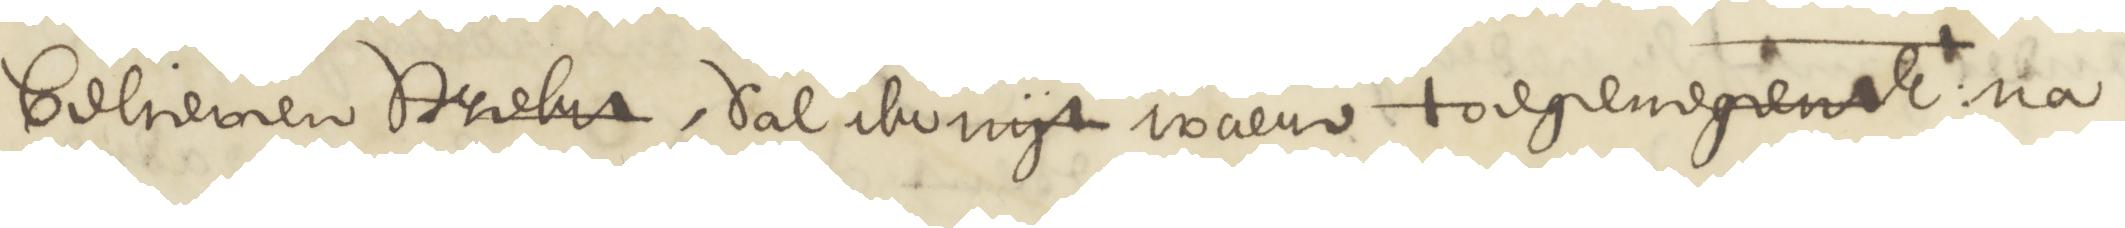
believen strekt, sal ik uijt waere toegenegenth:t na
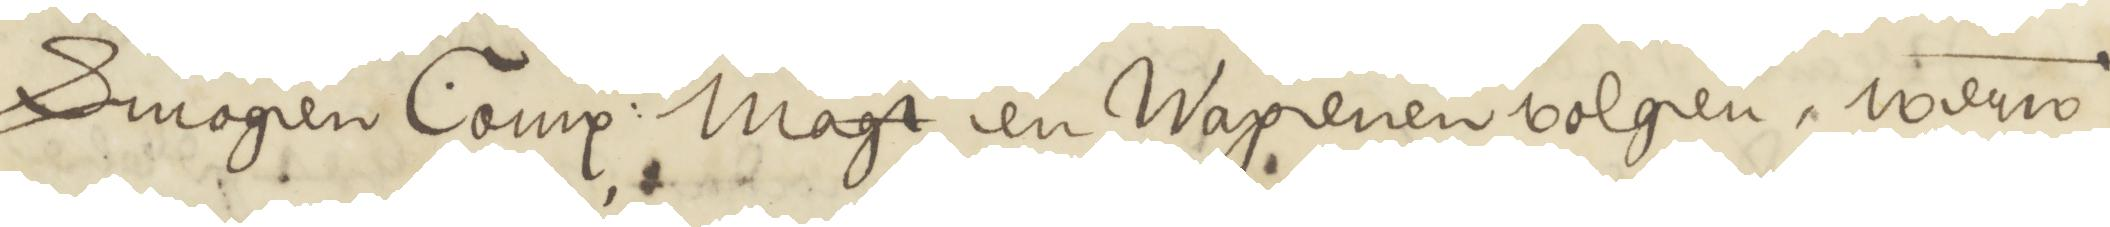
vermogen Comp:s Magt en Wapenen volgen, werw
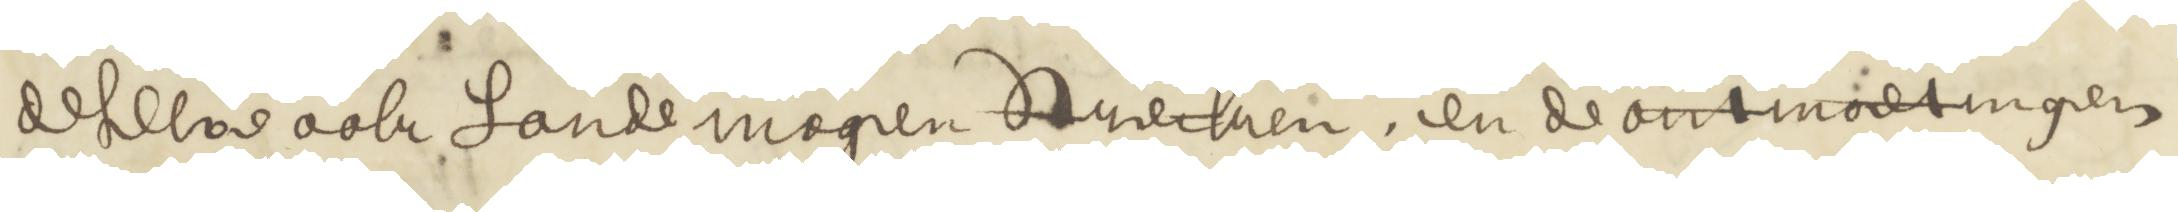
deselve ook soude mogen strecken, en de ontmoetingen
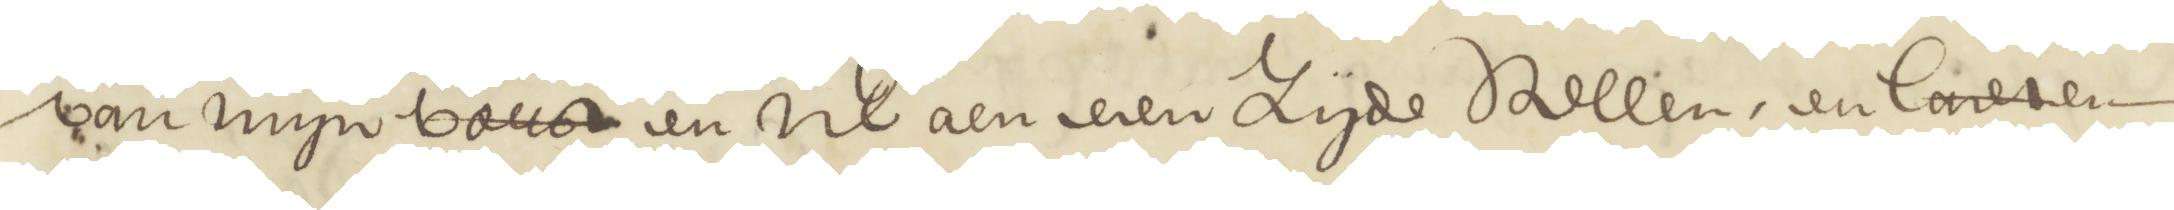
van mijn vorst en uE aen een zijde stellen, en laeten
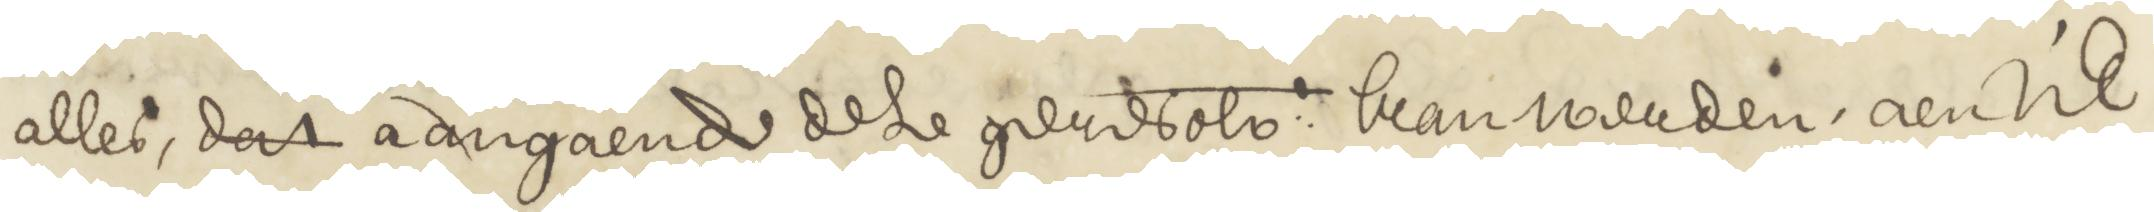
alles, dat aangaende dese geresolv:t kan werden, aen UE
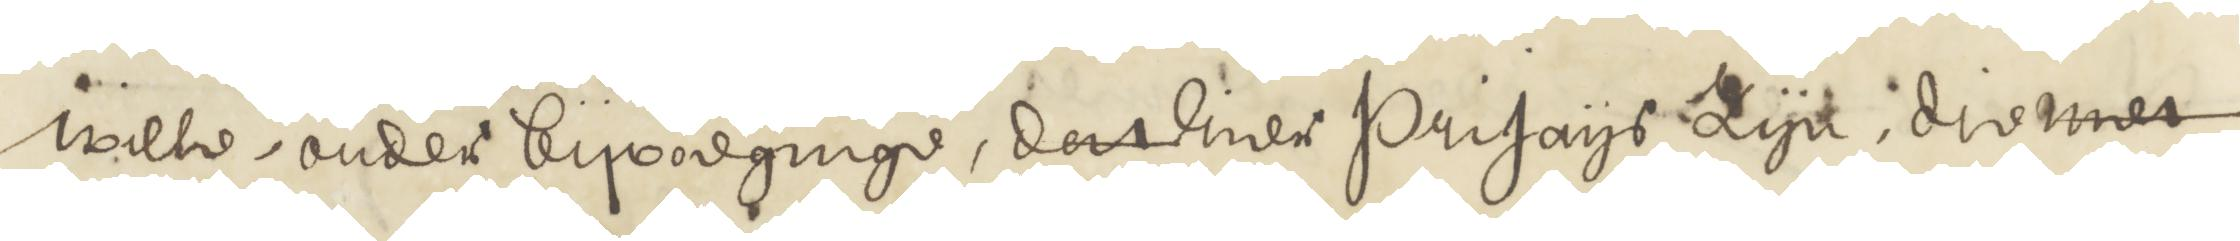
wille, onder bijvoeginge, dat hier Prijaijs zijn, die met
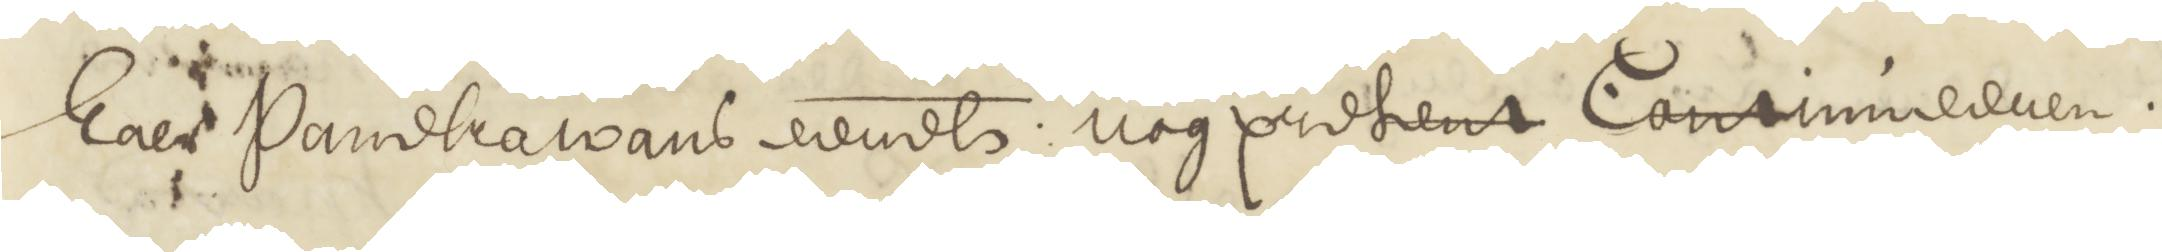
haer Panekawans eenelijk: nog present Continueeren
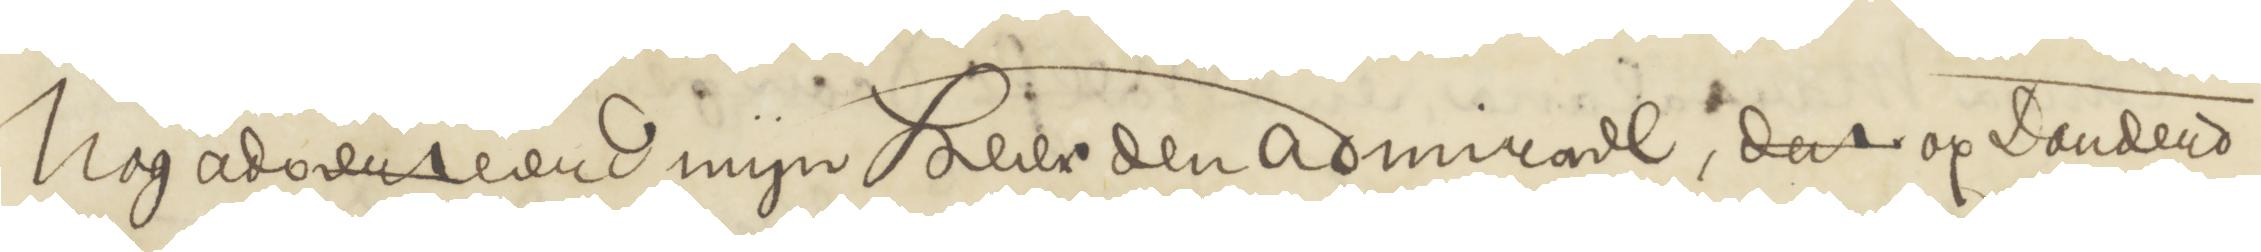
Nog adverteere mijn Heer den admirael, dat op Donderd
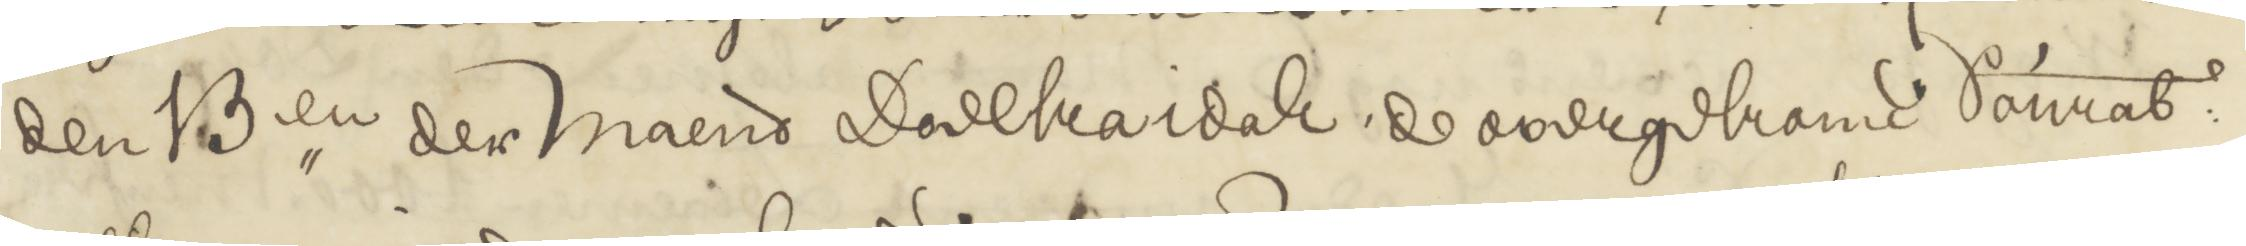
den 13„en der maend Doelkaidah, de overgekome sourab:e
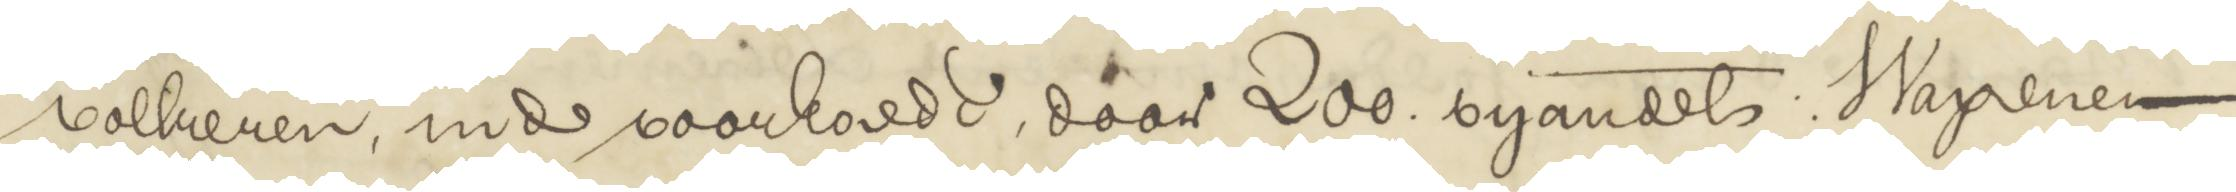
volkeren, in de voorhoede, door 200. vijandelijke: Wapenen,
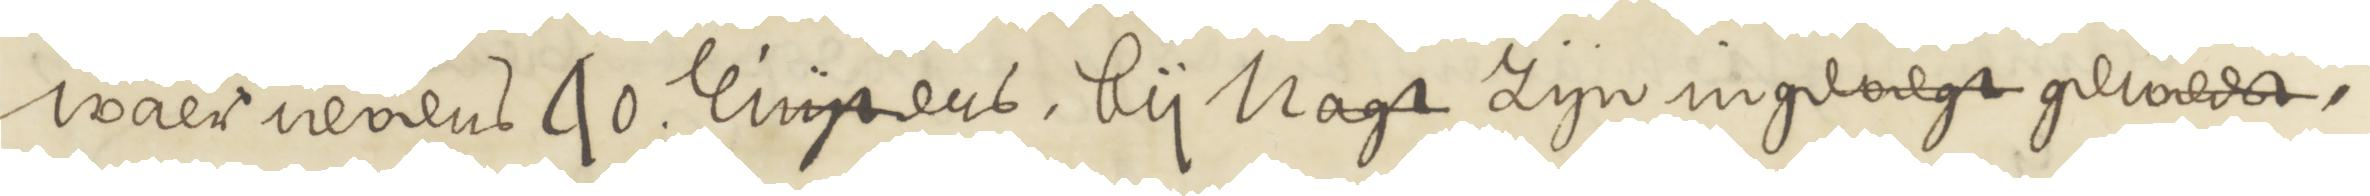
waer nevens 40. ruijters, bij nagt zijn in gevegt geweest,
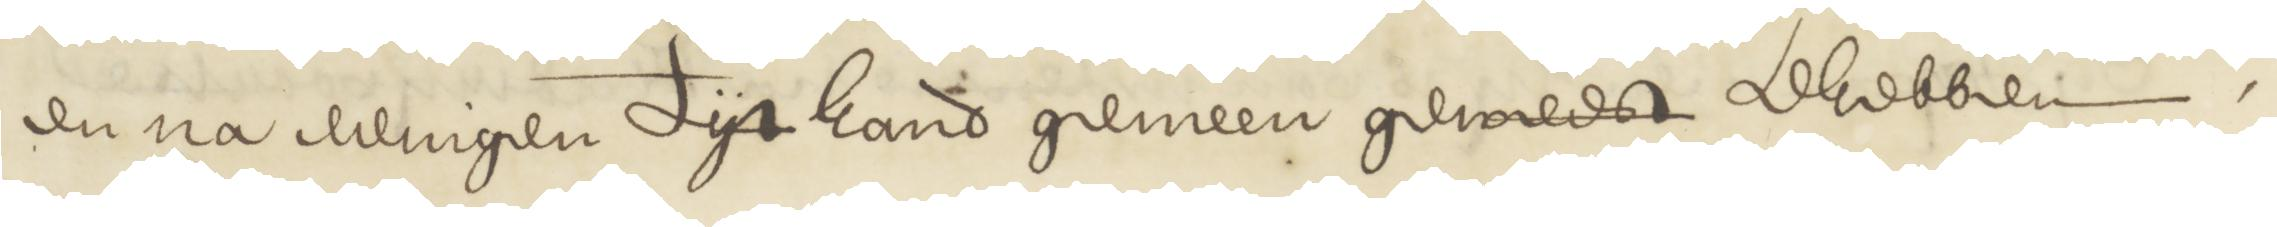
en na eenigen tijt hand gemeen geweest te hebben,
